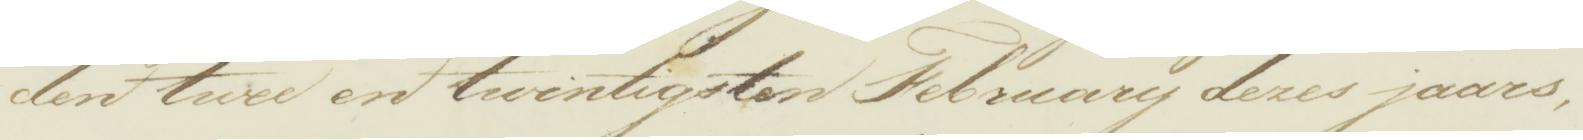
den twee en twintigsten February dezes jaars,
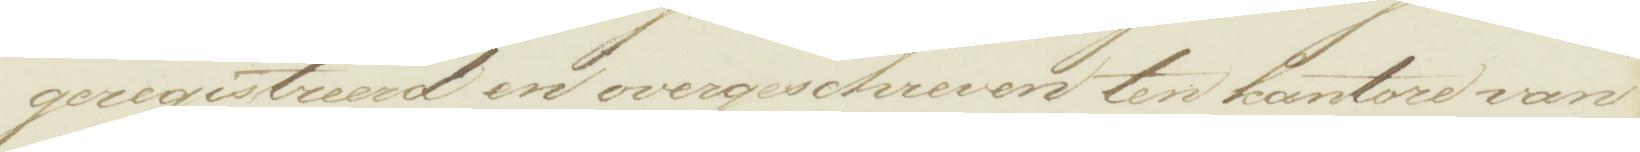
geregistreerd en overgeschreven ten kantore van
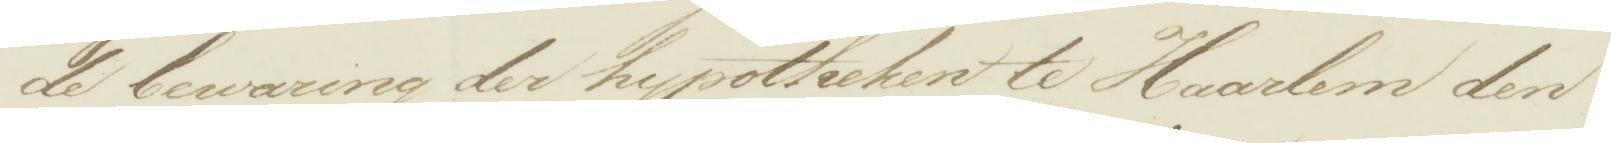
de bewaring der hypotheken te Haarlem den
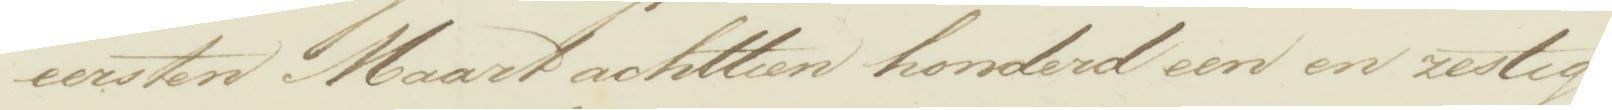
eersten Maart achttien honderd een en zestig
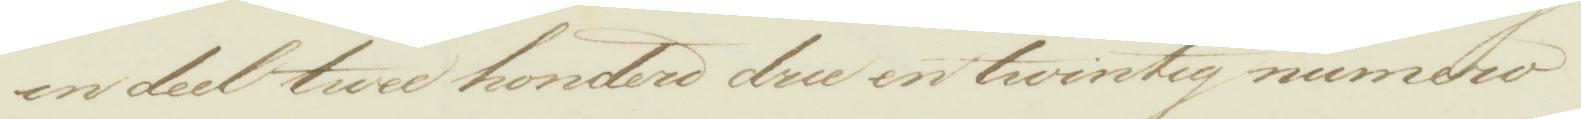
en deel twee honderd drie en twintig numero
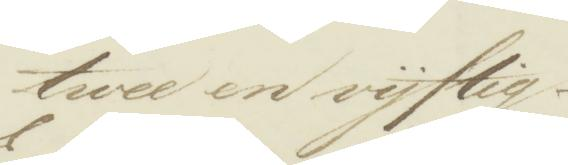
twee en vijftig.
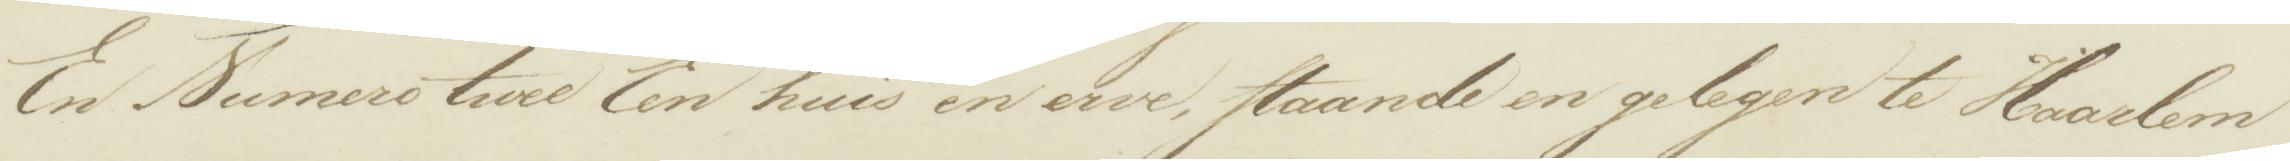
En Numero twee Een huis en erve, Staande en gelegen te Haarlem
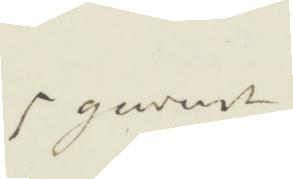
¶ geweest
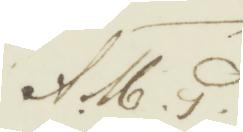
A. M. T.
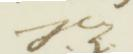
V.Z
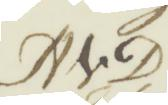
AVDj=
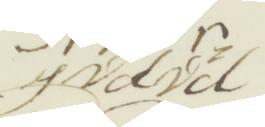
JVdVel
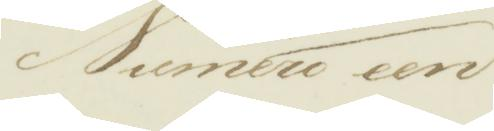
Numero een
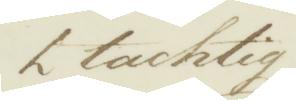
¶ tachtig
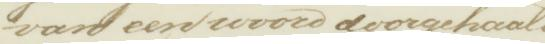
van een woord doorgehaald
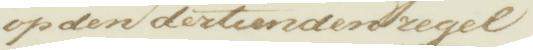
op den dertienden regel
